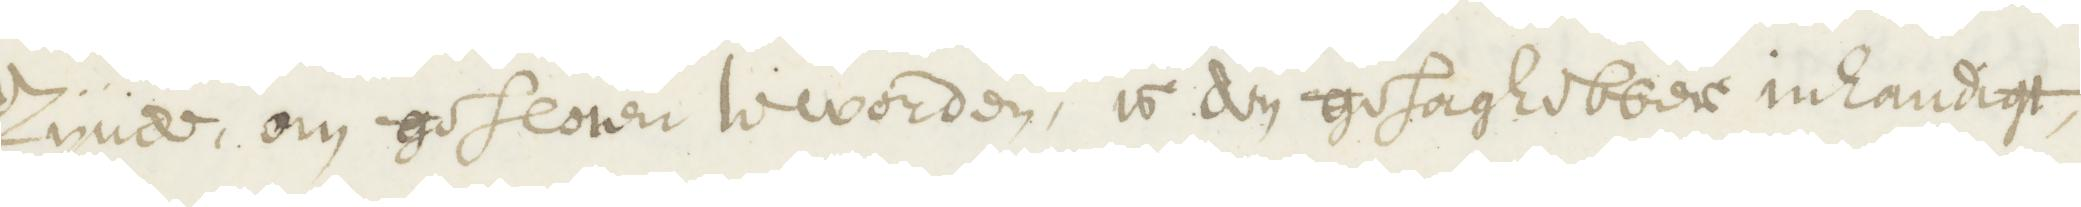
zijnde, om gesloten te worden, is den gesaghebber inhandigt,
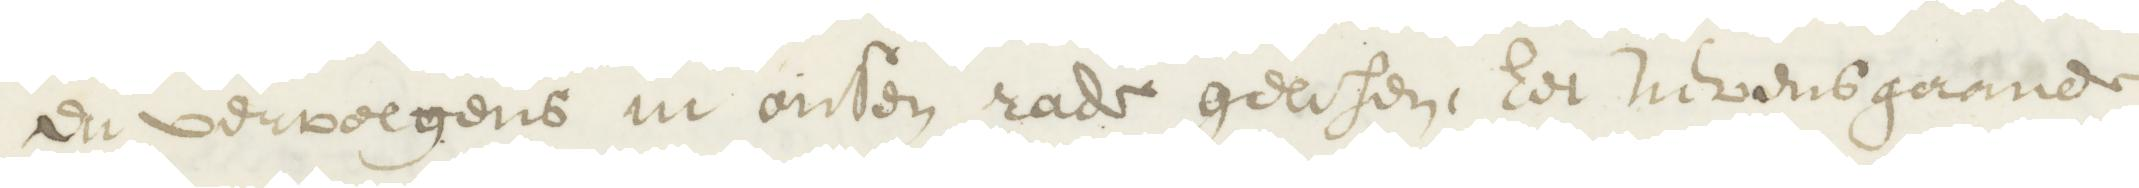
en vervolgens in onsen rade gelesen, het Nevens gaande
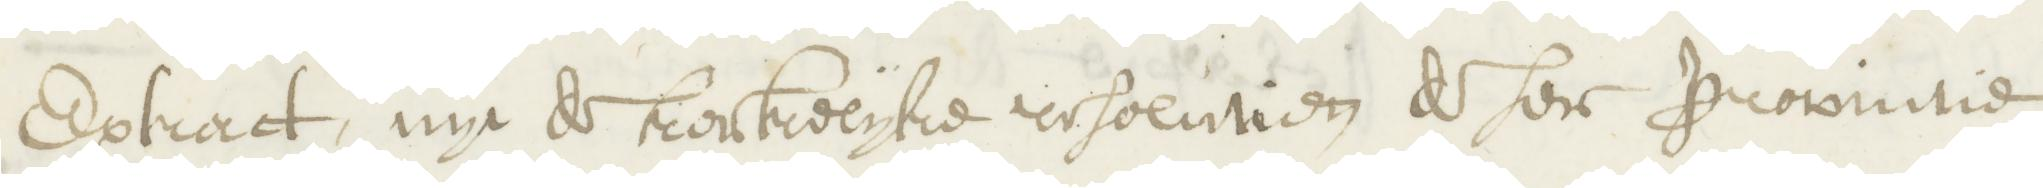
Extract, uijt de kerkelijke resolutien deser Provintie,
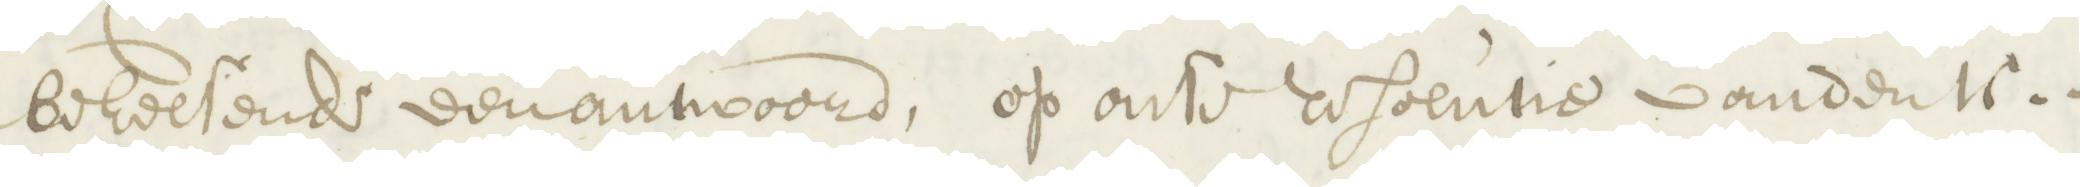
behelsende een antwoord, op onse resolutie vanden 15.
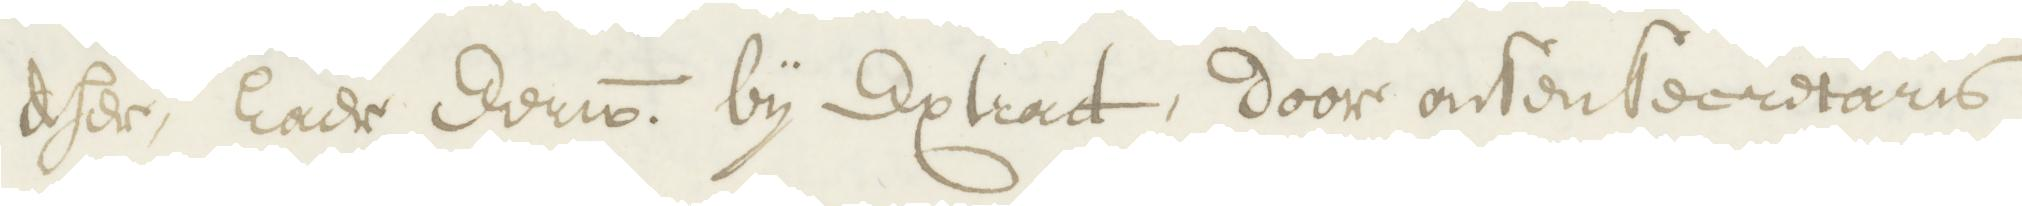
deser, haer Eerw. bij Extract, door onsen secretaris
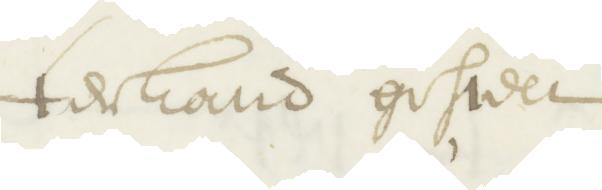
terhand gestelt
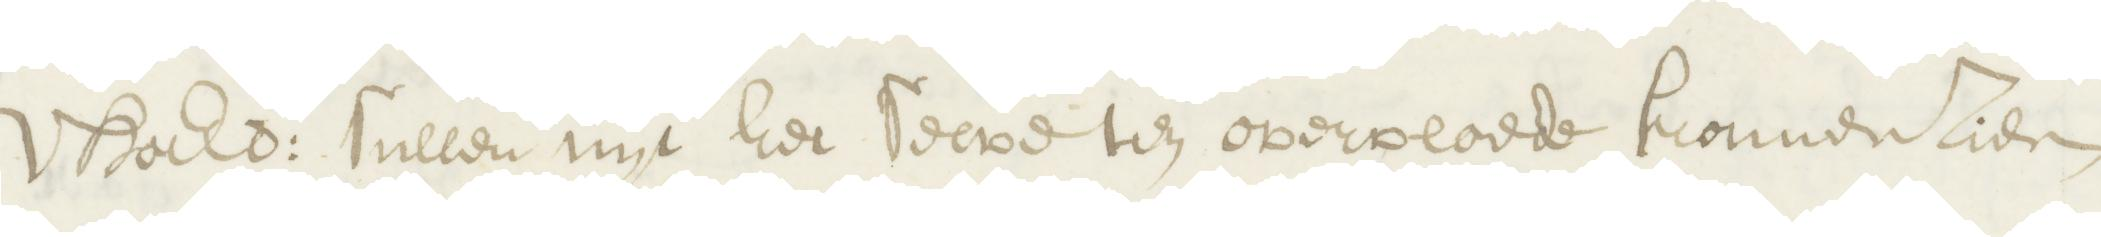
VHoEd: sullen uijt het selve ten overvloede konnen zien,
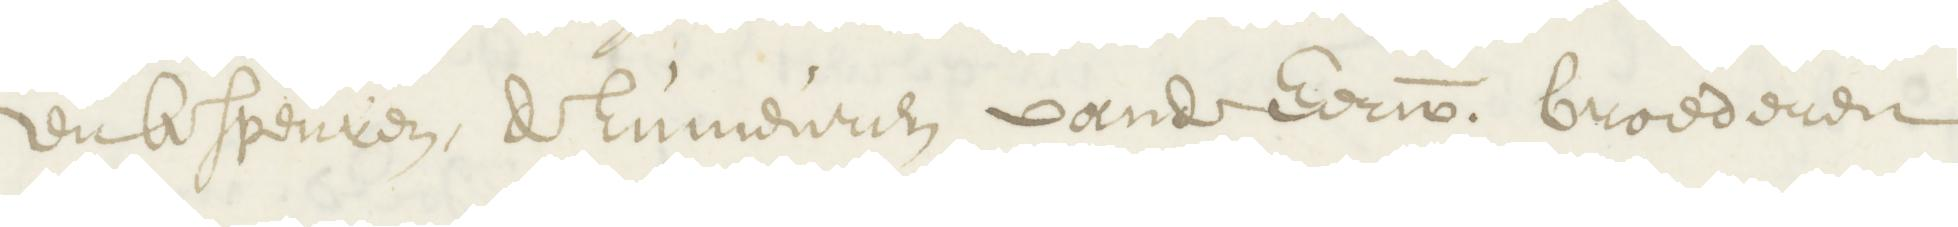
en bespeuren, de humeuren vande Eerw. broederen
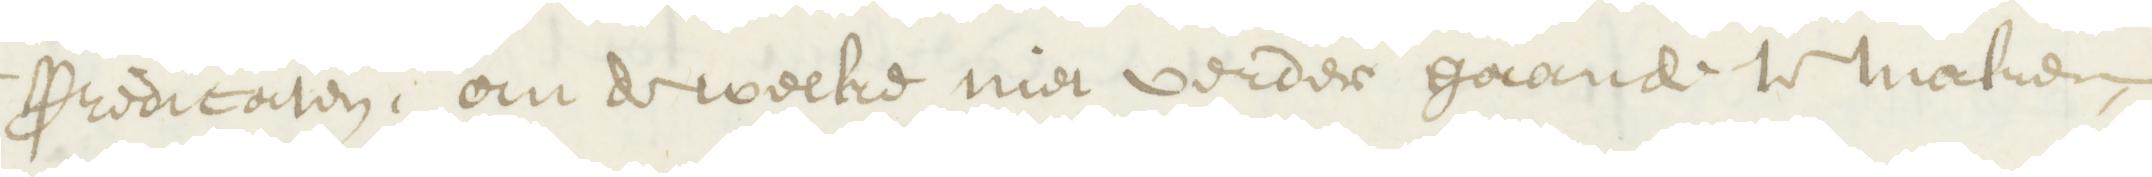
Predicaten, om dewelke niet verder gaande te maken,
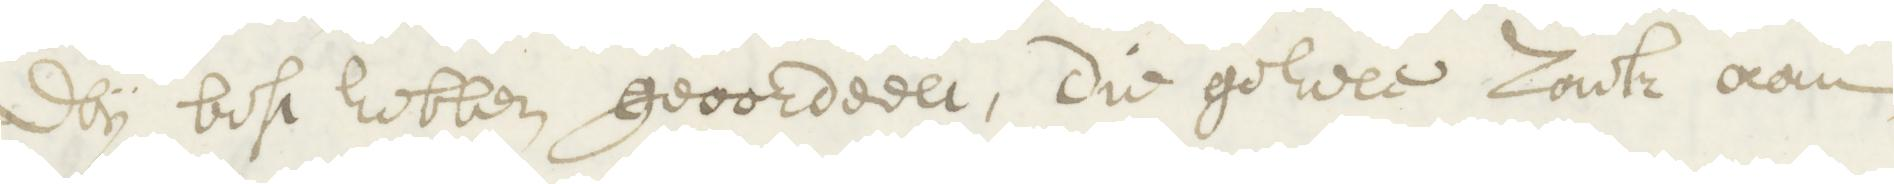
Wij best hebben geoordeelt, die gehele zaek aan
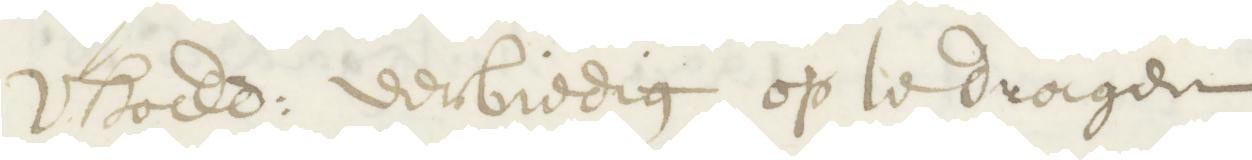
VHoEd: eerbiedig op te dragen
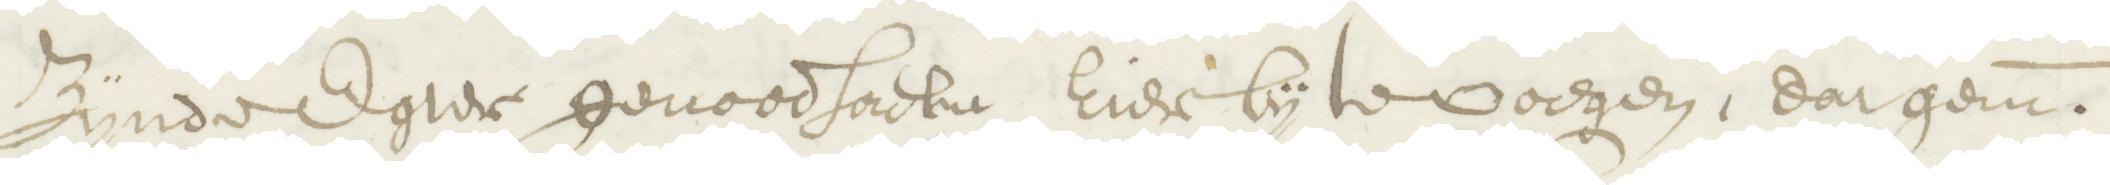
Zijnde Egter genoodsaekt hier bij te voegen, dat gem.
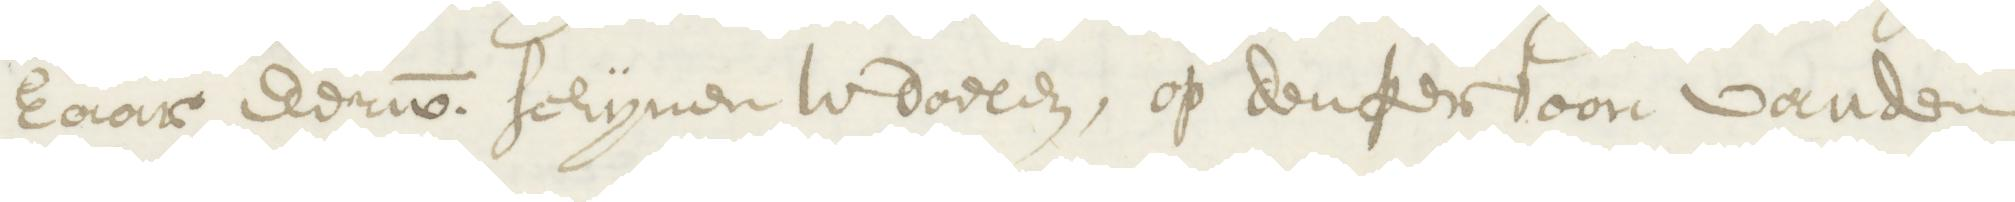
haar Eerw. schijnen te doelen, op den persoon vanden
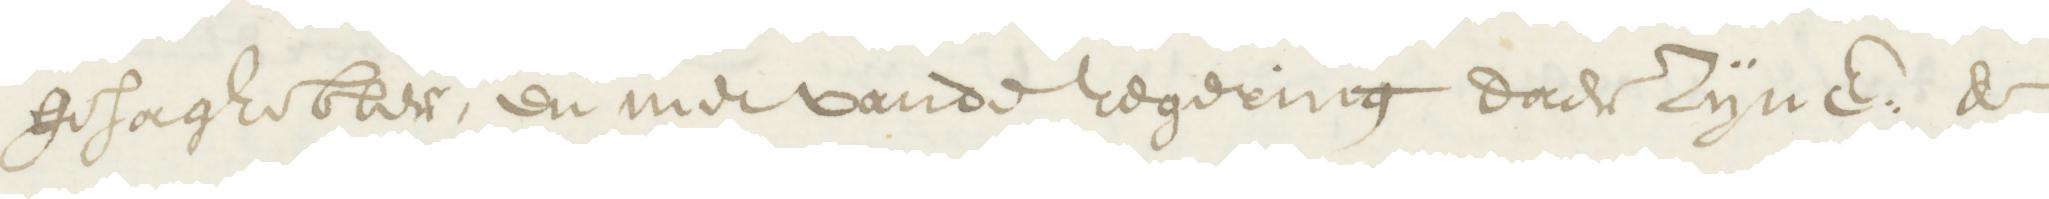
gesaghebber, en met vande regering daer zijn E: de
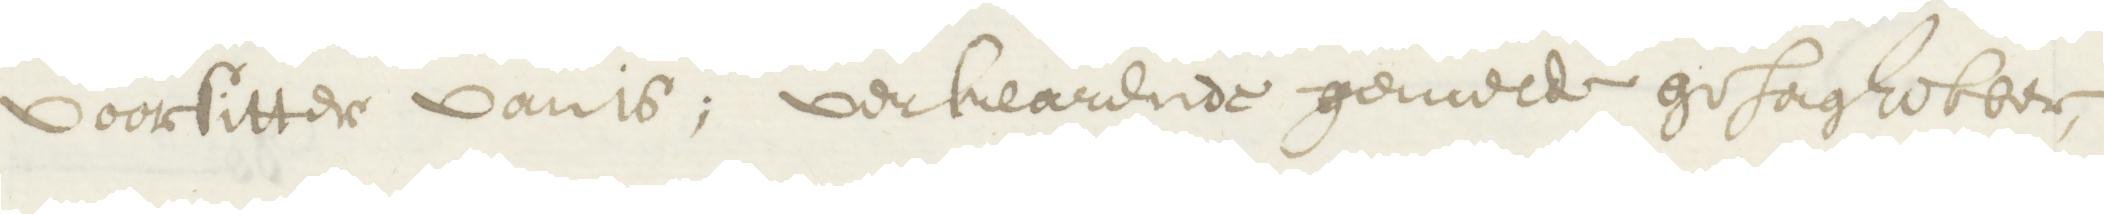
voorsitter van is; verklarende gemelde gesaghebber,
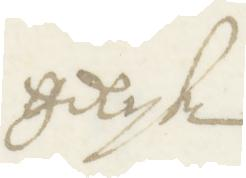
gelyk
